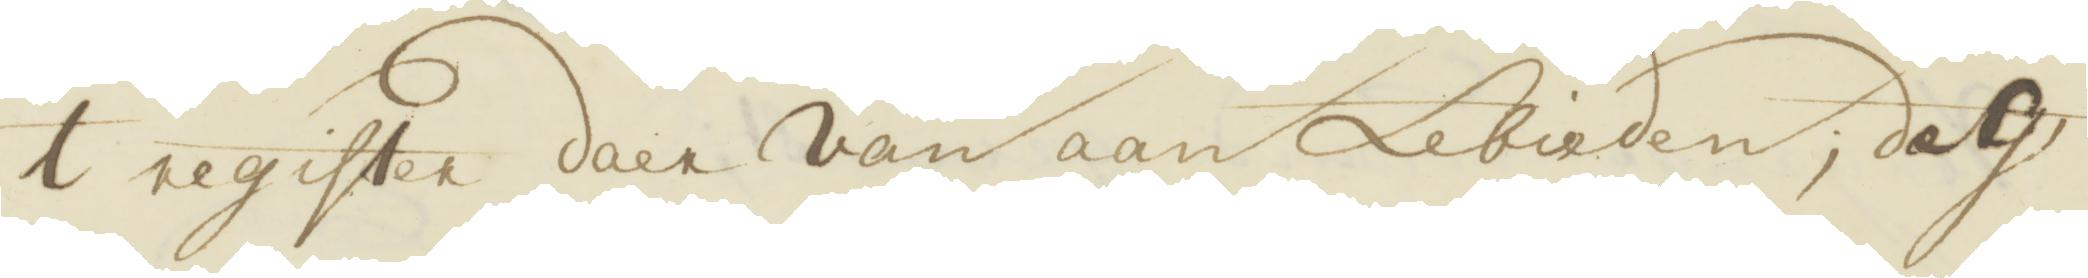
't register daer van aan tebieden; de g
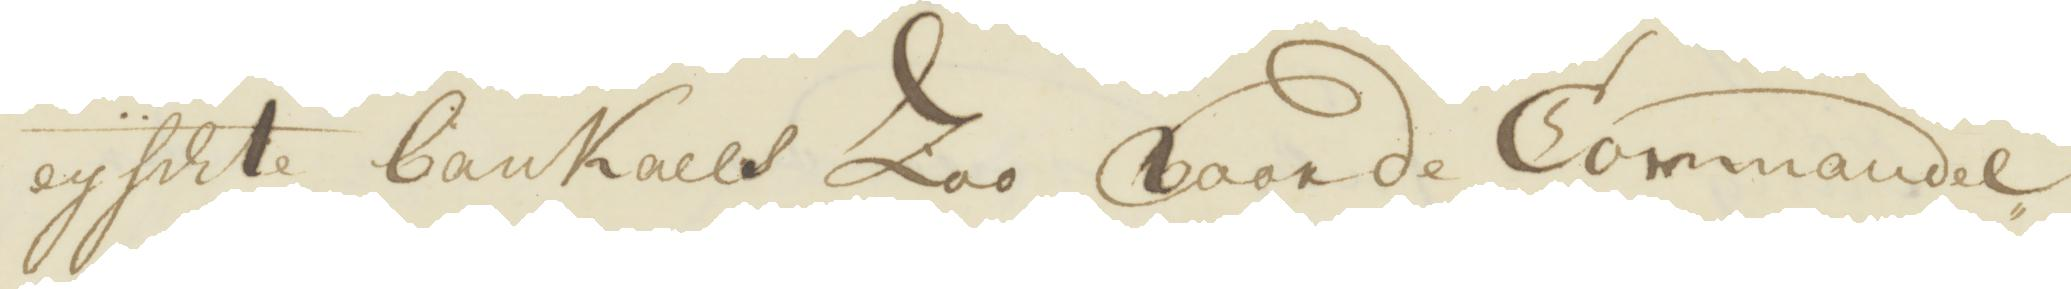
eijschte bankaels zoo voor de Cormandel„
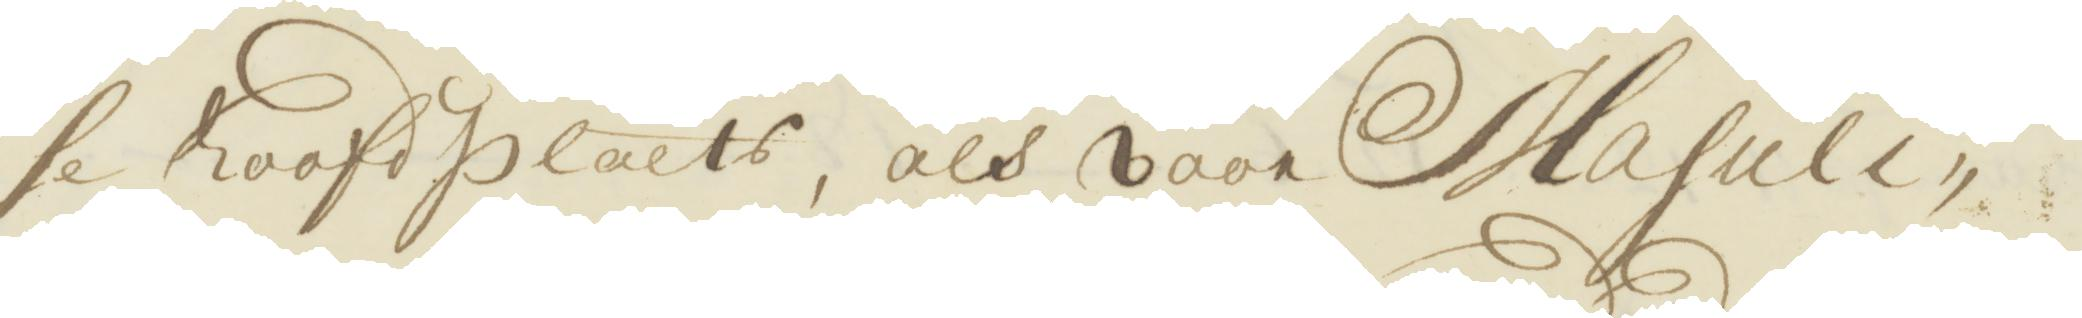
se hoofd plaets, als voor Masuli„
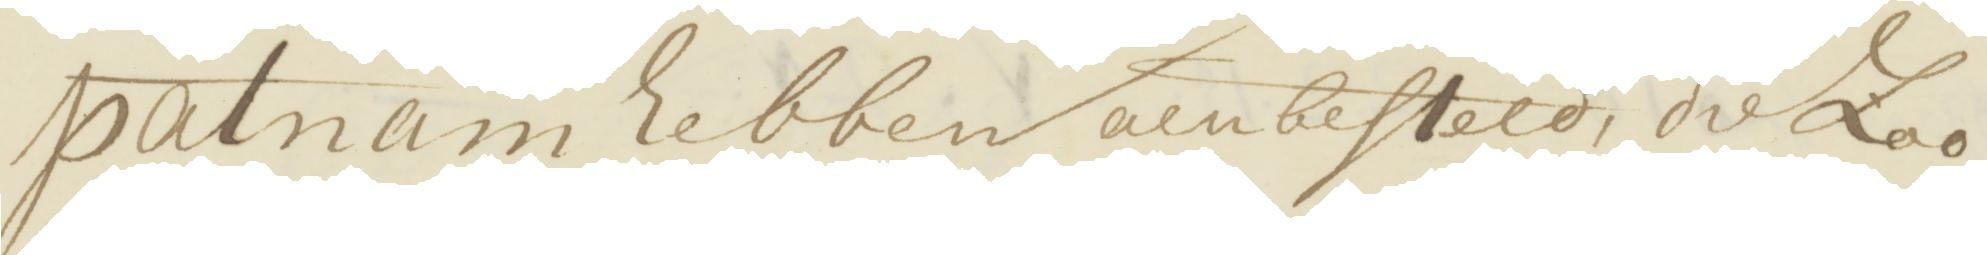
patnam hebben aen besteld, die zoo
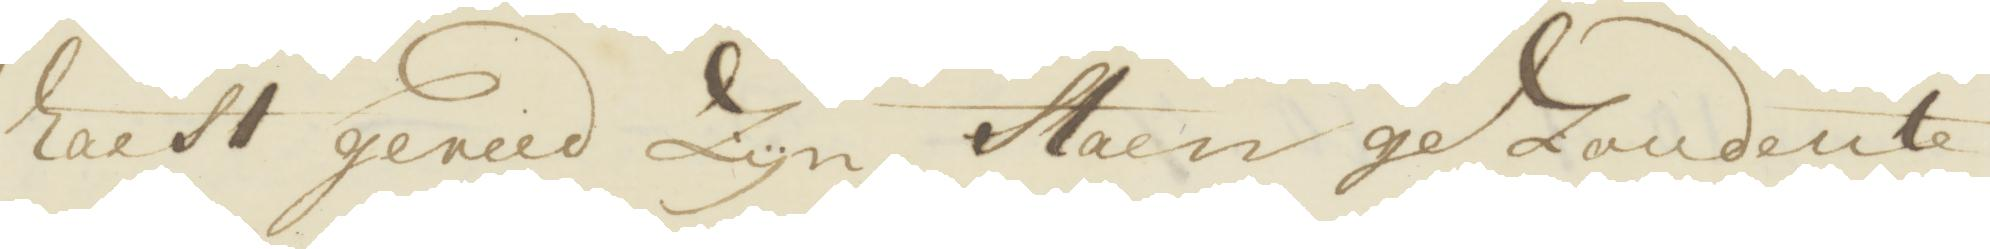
haest gereed zijn, staen gezonden te
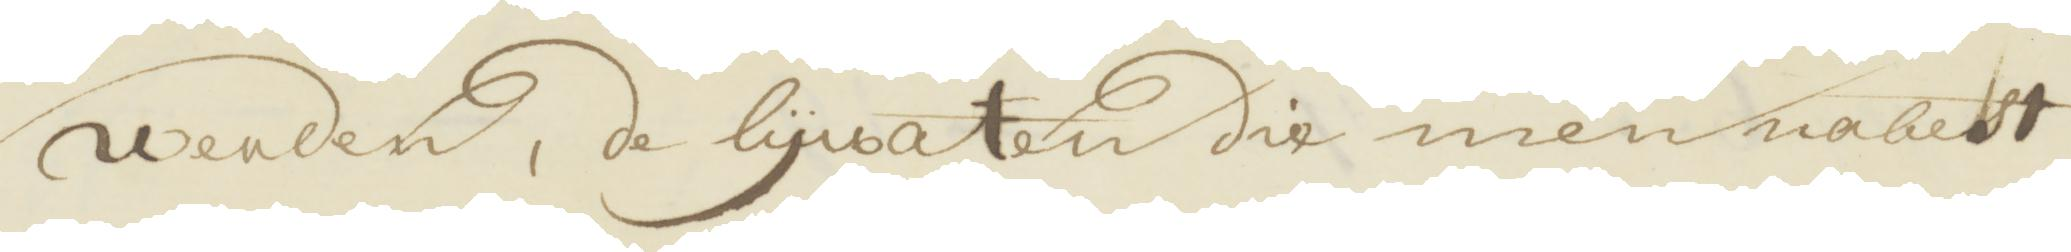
werden, de lijwaten die men na best
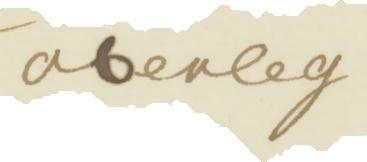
overleg
